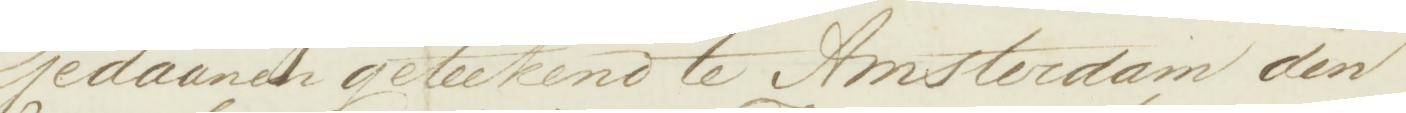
Gedaan en geteekend te Amsterdam den
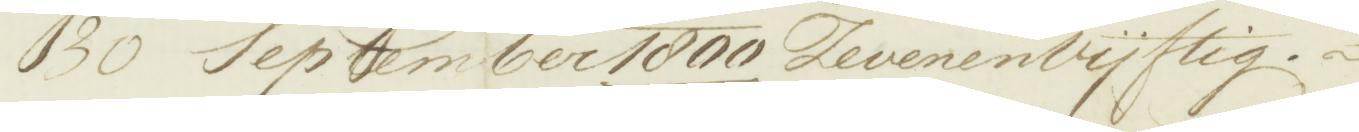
30 September 1800 Zevenenvijftig.
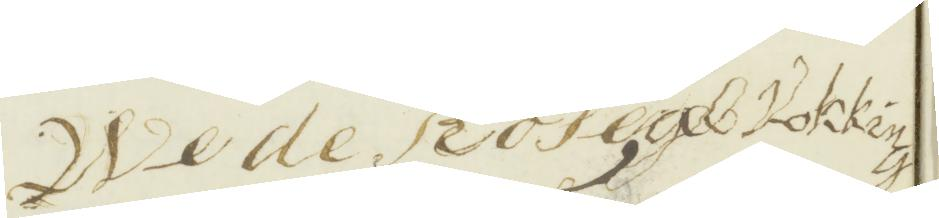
We de Bote, geb Kokking
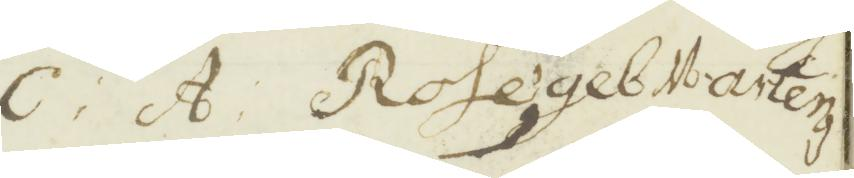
C: A: Rose geb Marter
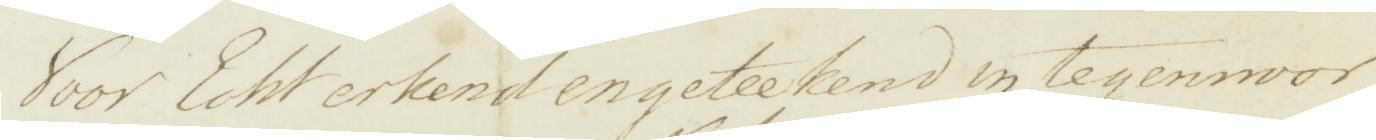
Voor Echt erkend en geteekend in tegenwoor
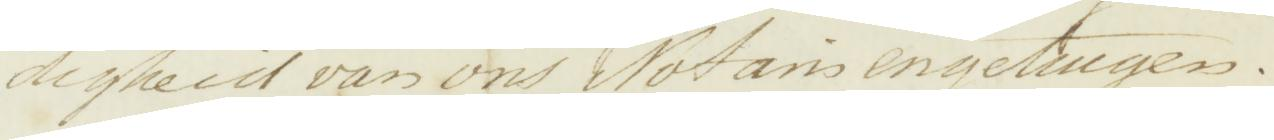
digheid van ons Notais en getuigen.
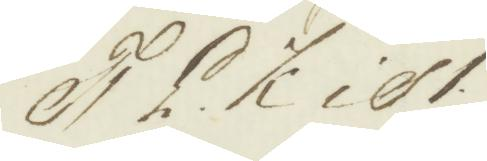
I L. Kist
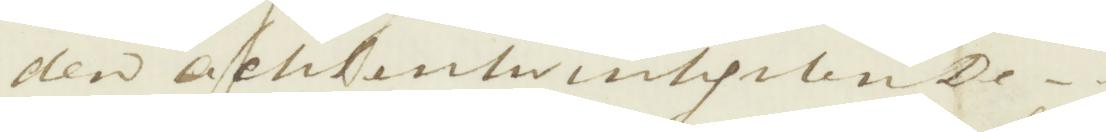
den achtentwintigsten De-
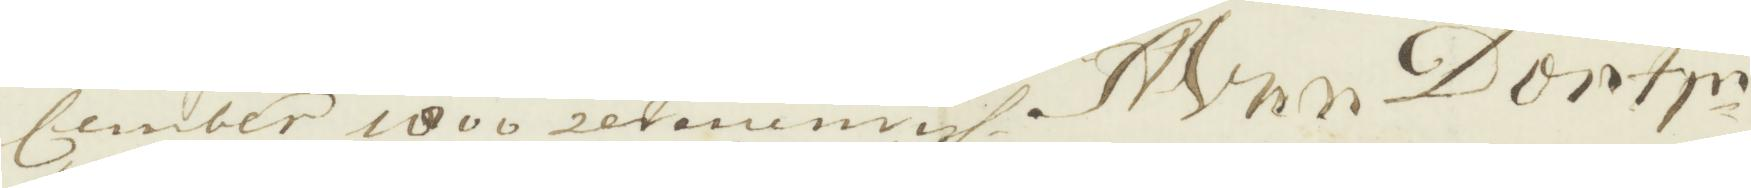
cember 1800 zevenenvyf A Van Dort j-r
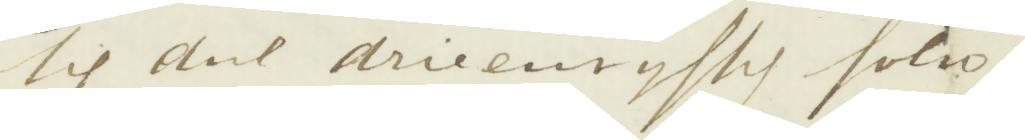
tig deel drie en vyftig folio
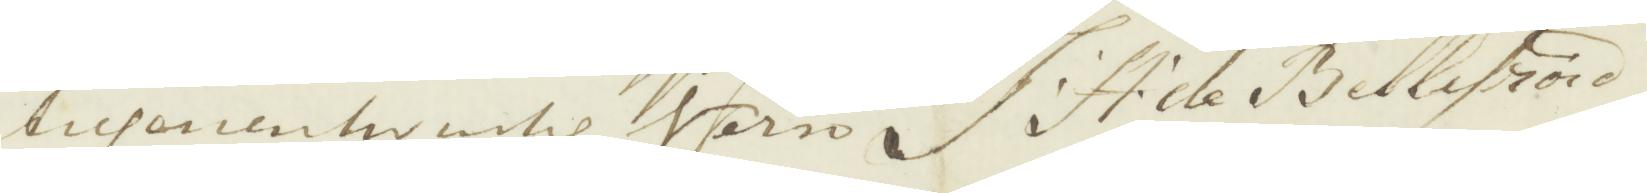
vyfenentwintig Verso I H de Bellefroid
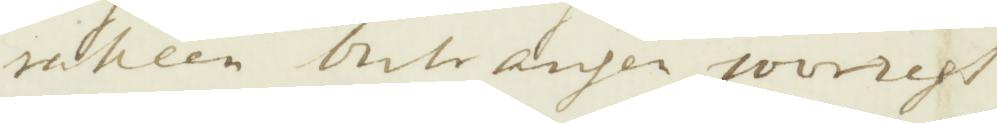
vak een met desen voorregt
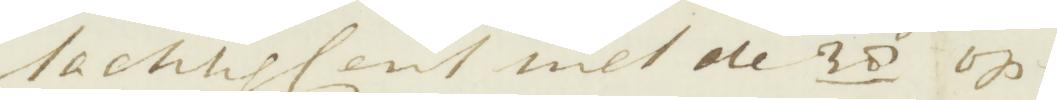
tachtig Cent met de 30 op
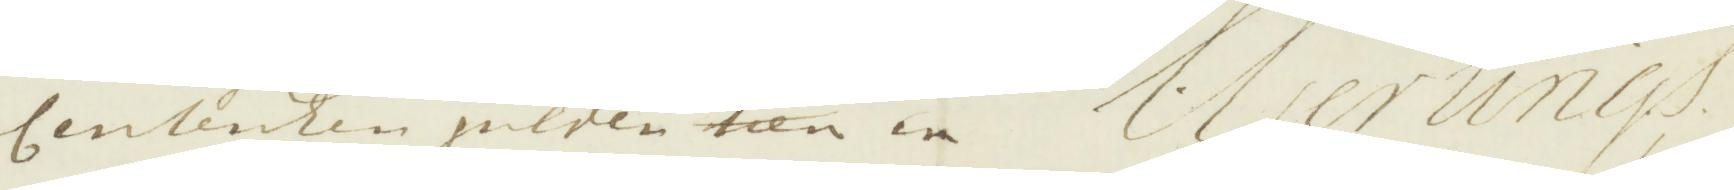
Centen Een gulden tien C Gerlings
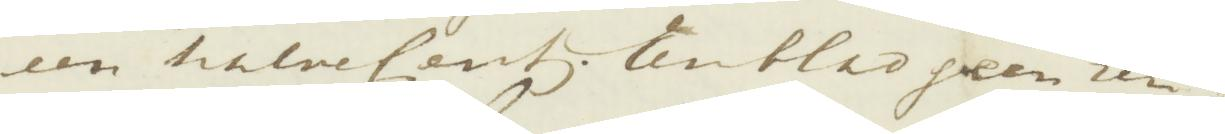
een halve Cent Een blad geen ren
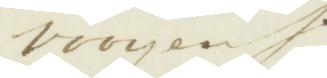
vooyen
